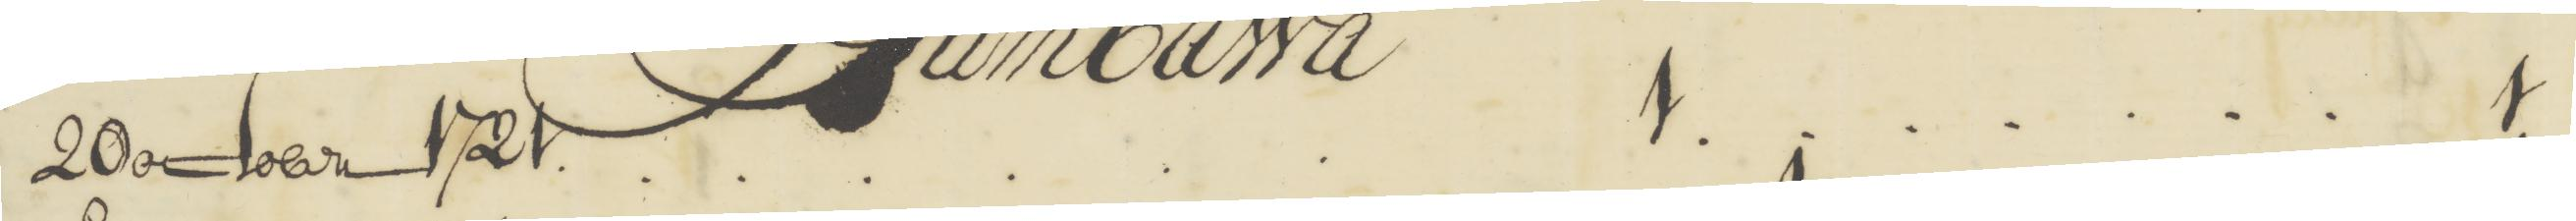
20 october 1721. . . . . . . 1. . . . . . . 1
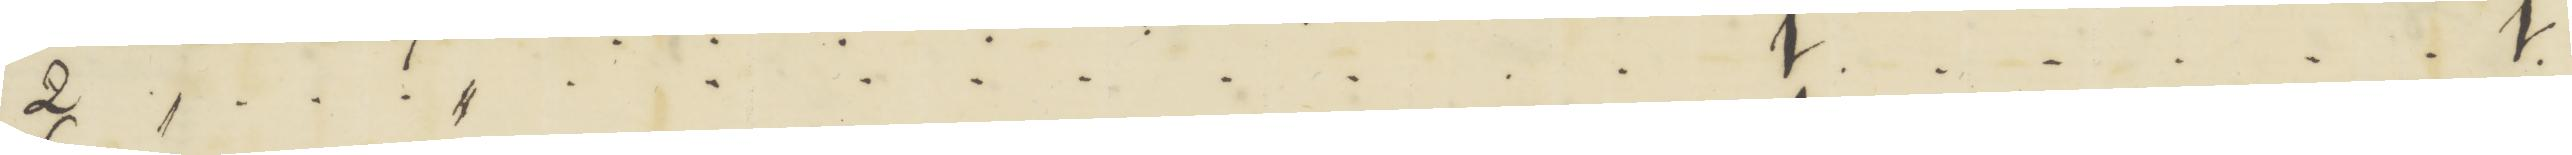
2 . „ . . . „ . . . . . . . . . 1 . . - . . - 1.
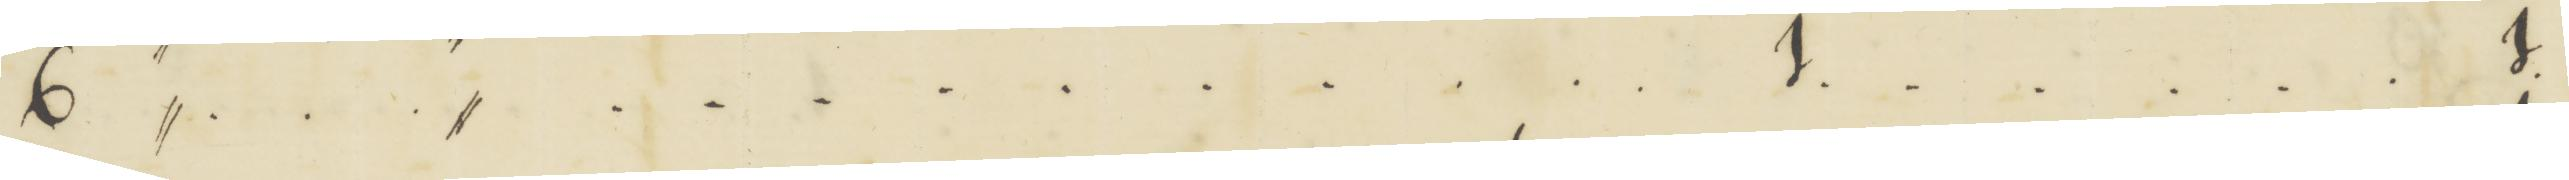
6 „ . . . „ - - - - . . . . . . 1. . . . . . 1.
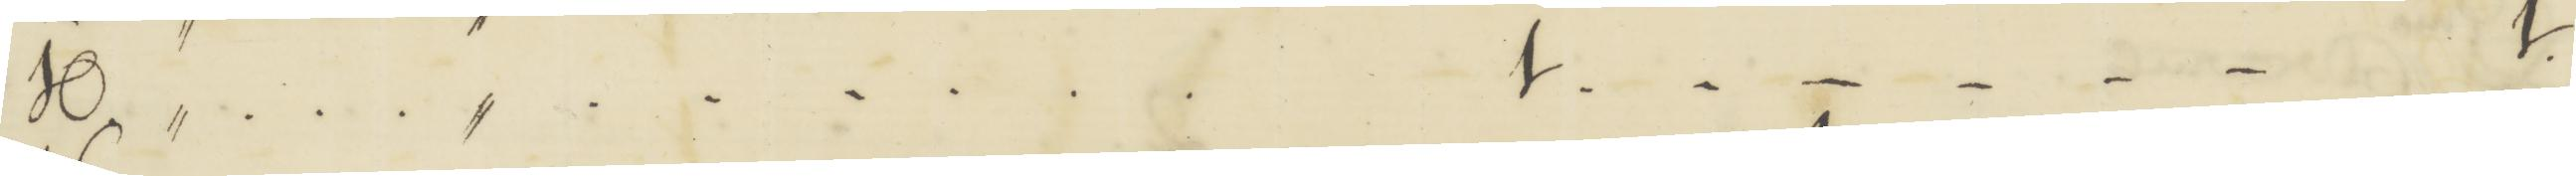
10. „ . . . „ . - - . . . 1. - – – – – 1.
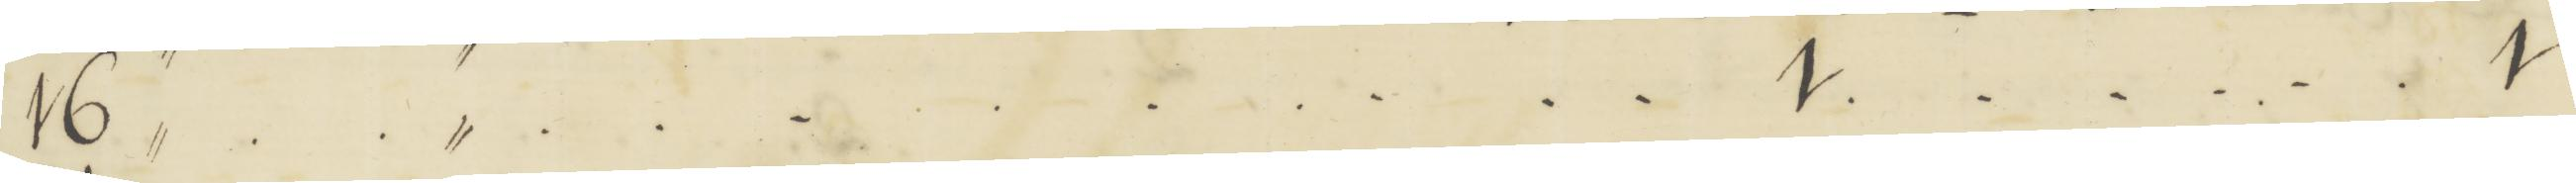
16 „ . . „ . . - . . . . . . 1. . . . - . 1
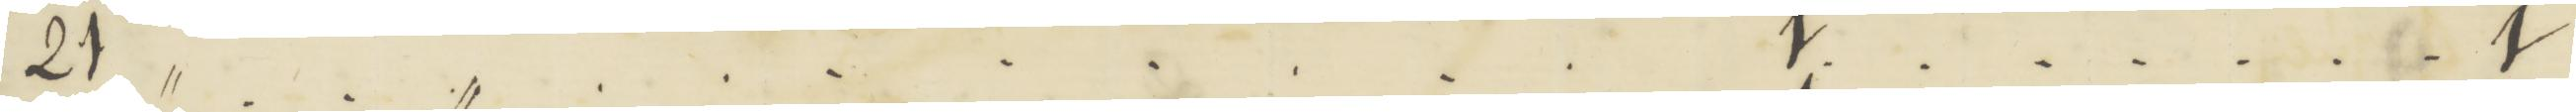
21 „ - - .„ . . - - . . - . 1. . . . . . - 1
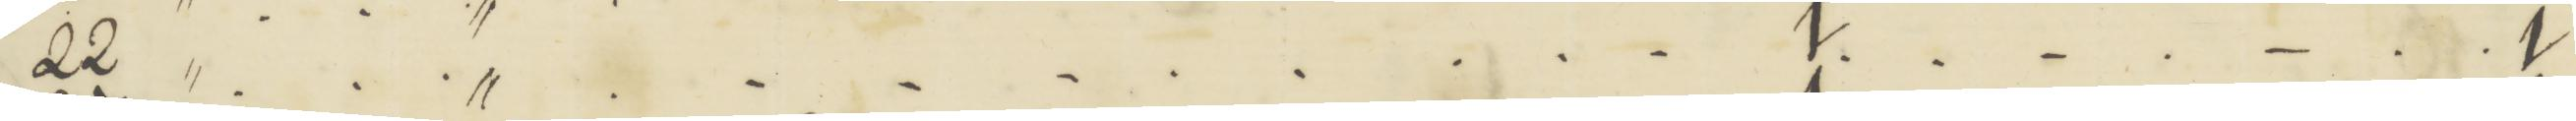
22 „ . . . „ . - - - . . . . - 1. . - . – . . 1
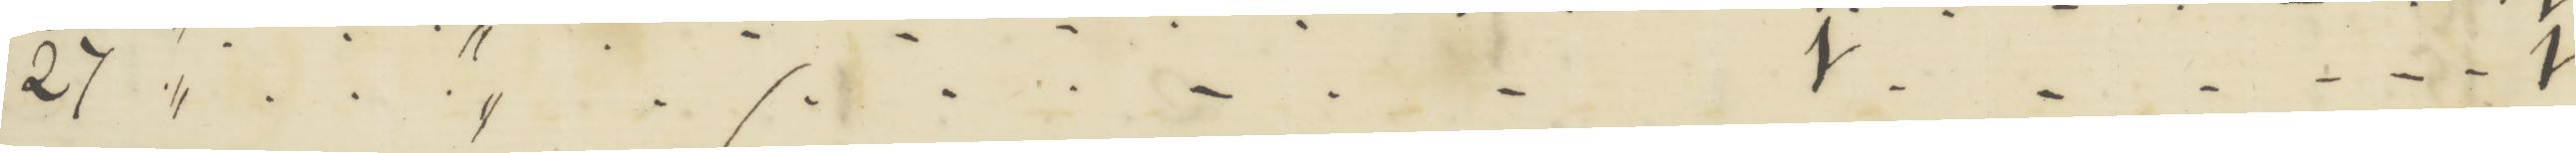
27 .„ . . . „ - - - . – . – 1 - - - - – – 1
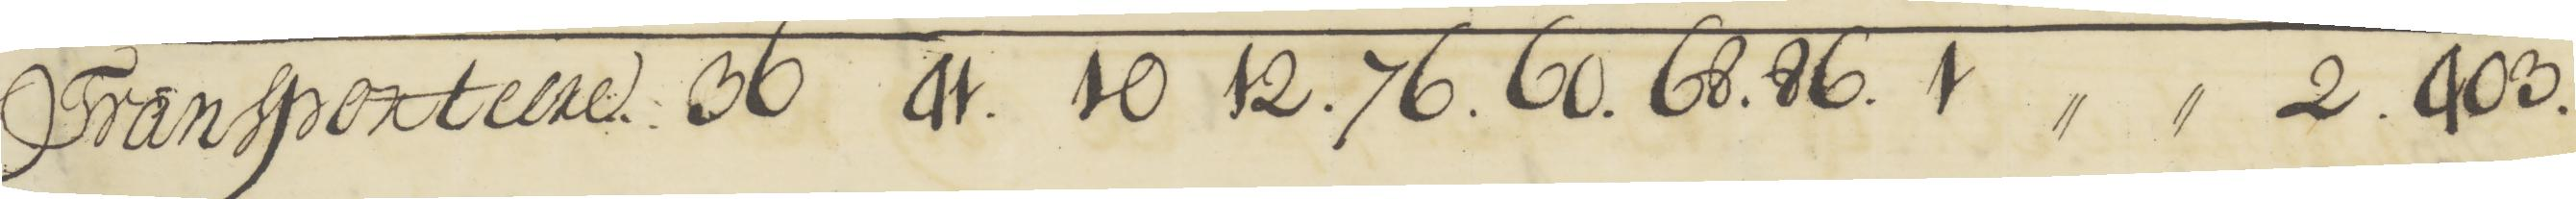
Transporteere.: 36 41. 10 12. 76. 60. 68. 86. 1 „ „ 2. 403.
